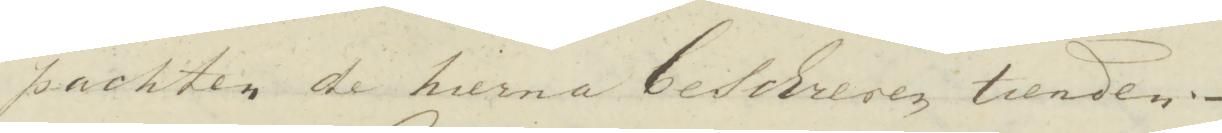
pachten de hierna beschreven tienden.
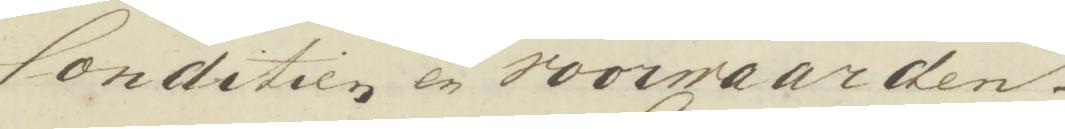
Conditien en voorwaarden.
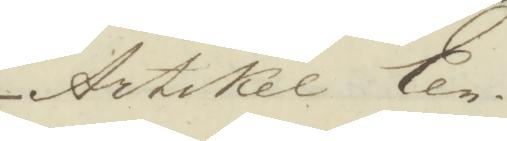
-Artikel Een.
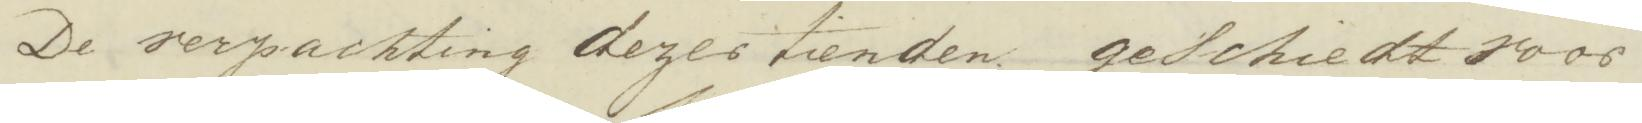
De verpachting dezer tienden geschiedt voor
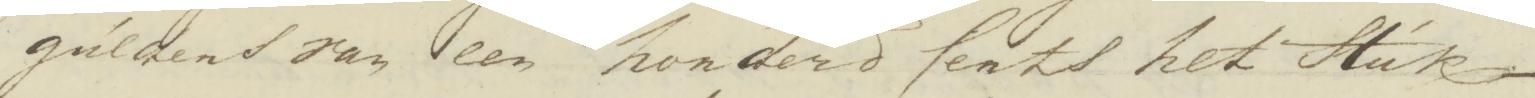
guldens van een honderd Cents het stuk
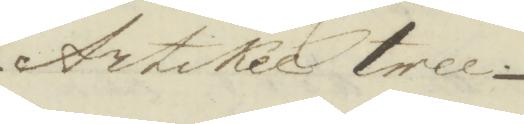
Artikel twee-
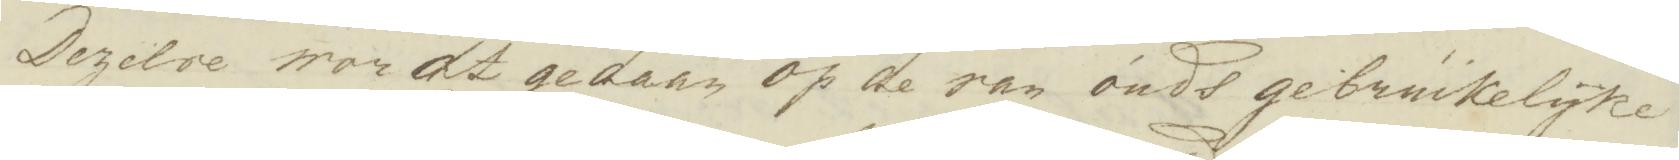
Dezelve wordt gedaan op de van ouds gebruikelijke
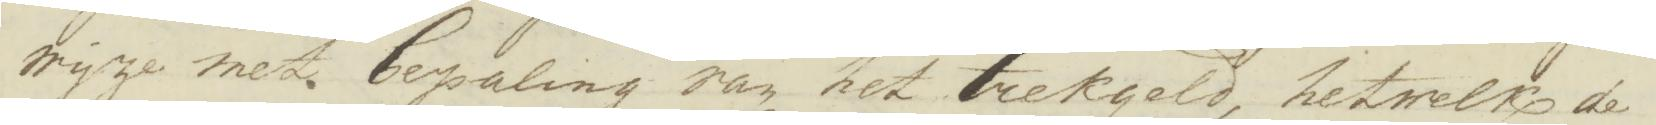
wijze met bepaling van het trekgeld, hetwelk de
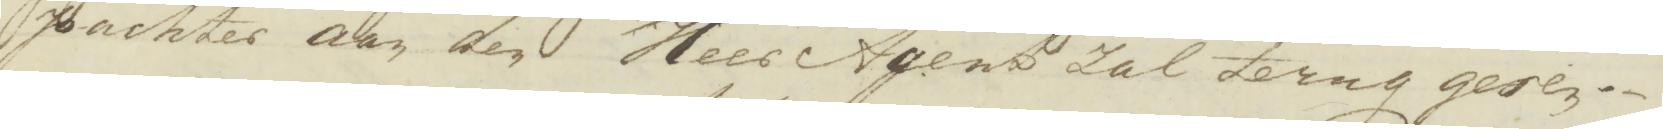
pachter aan den Heer Agent zal terug geven.-
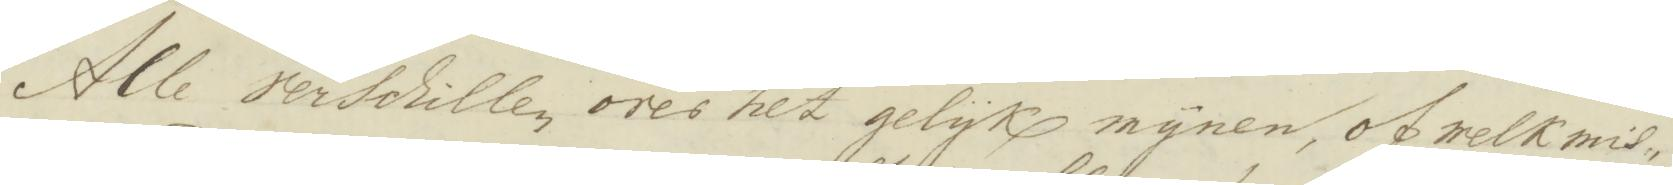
Alle verschillen over het gelijk mijnen, of welk mis„
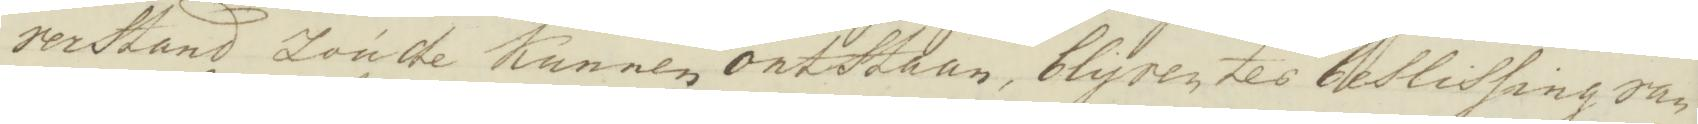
verstand zoude kunnen ontstaan, blijven ter beslissing van
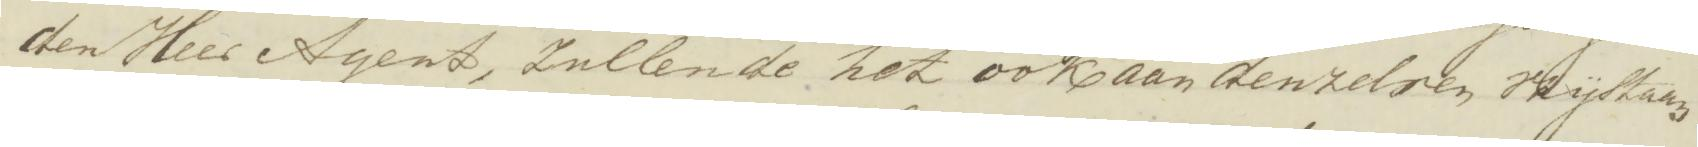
den Heer Agent, zullende het ook aan denzelven vrijstaan
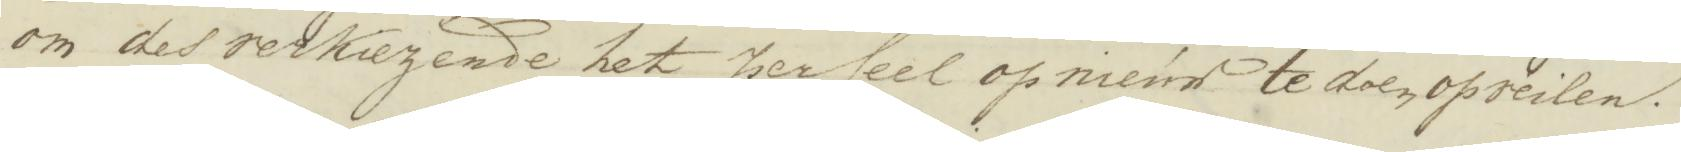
om des verkiezende het perceel opnieuw te doen opveilen.
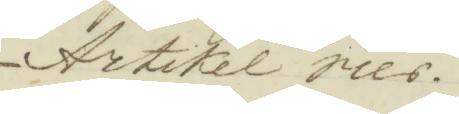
-Artikel vier.
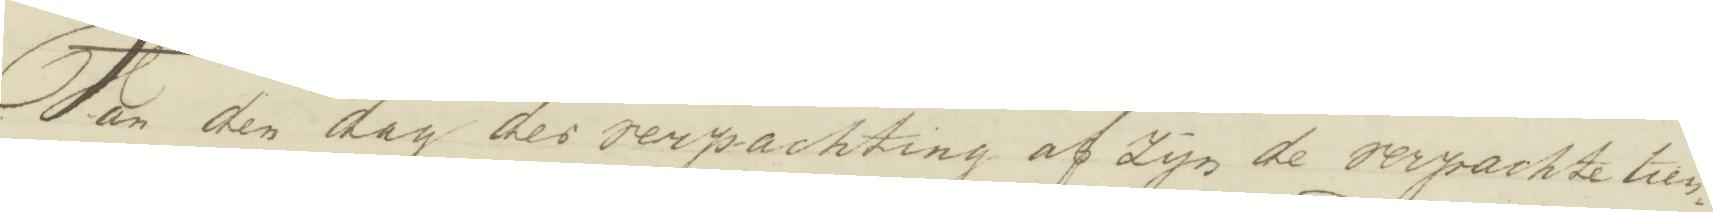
Van den dag der verpachting af zijn de verpachte tien„
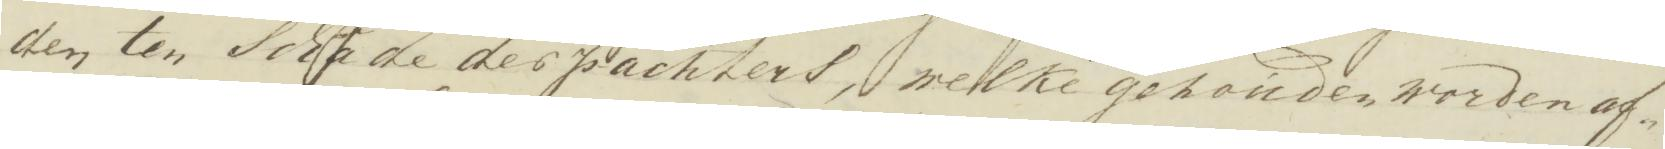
den ten schade der pachters, welke gehouden worden af„
